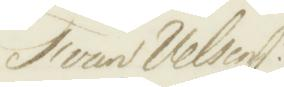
F van Velsen J
